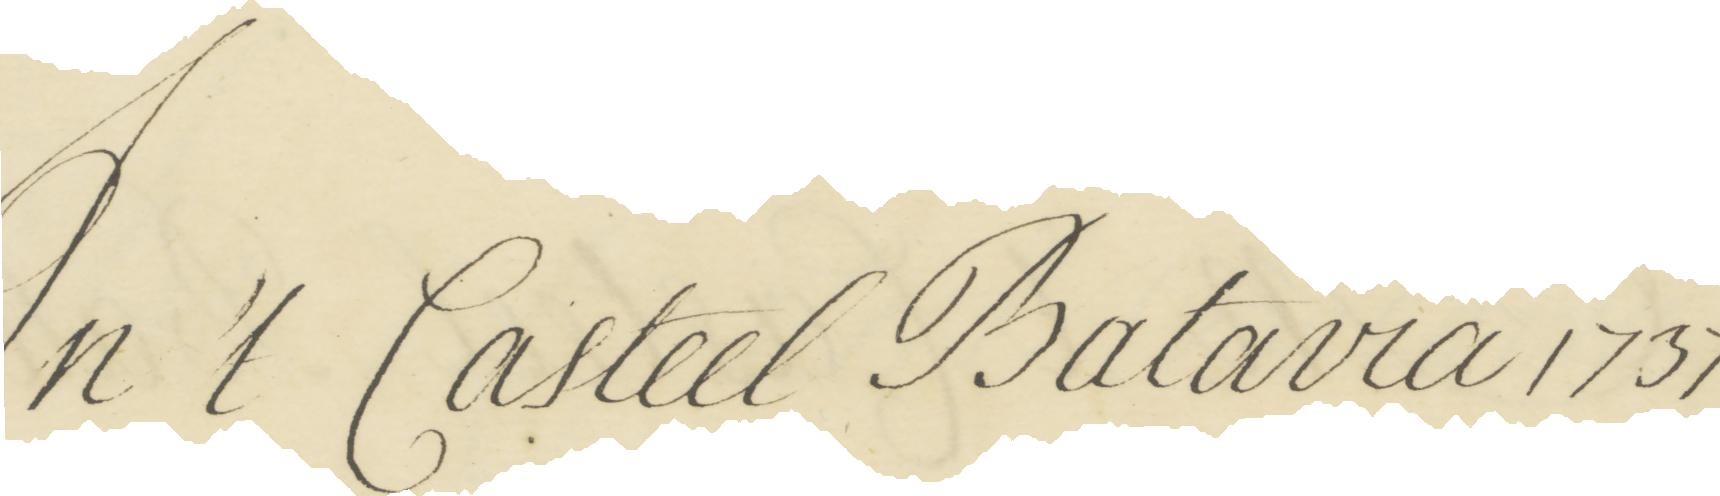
In ’t Casteel Batavia 1737
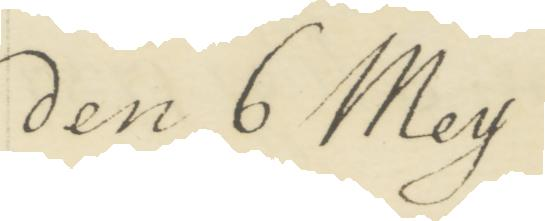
den 6 Mey
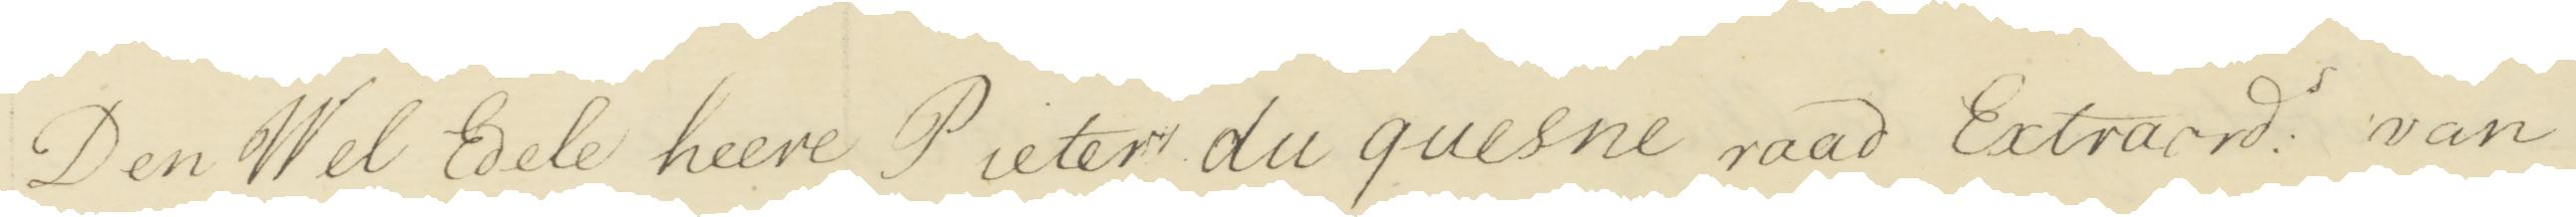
Den Wel Edele heere Pieter du quesne raad Extraord:s van
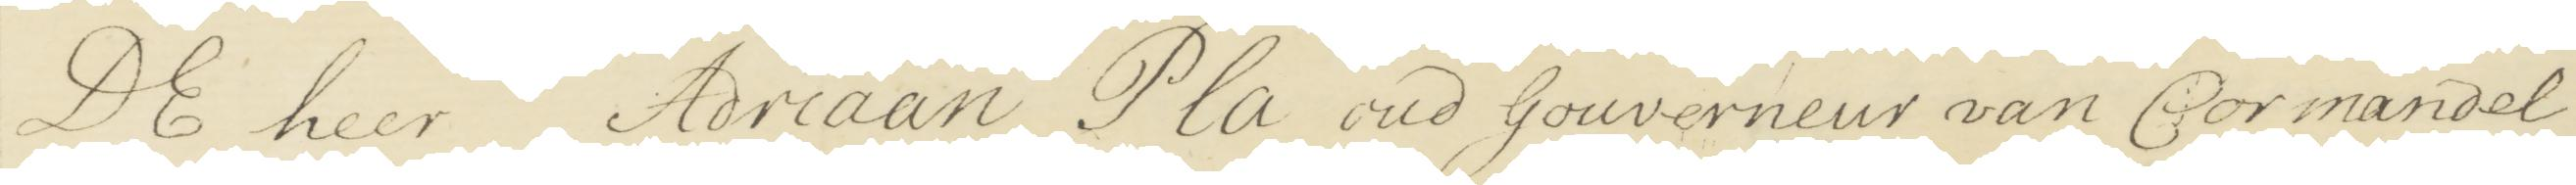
D E heer Adriaan Pla oud Gouverneur van Cormandel
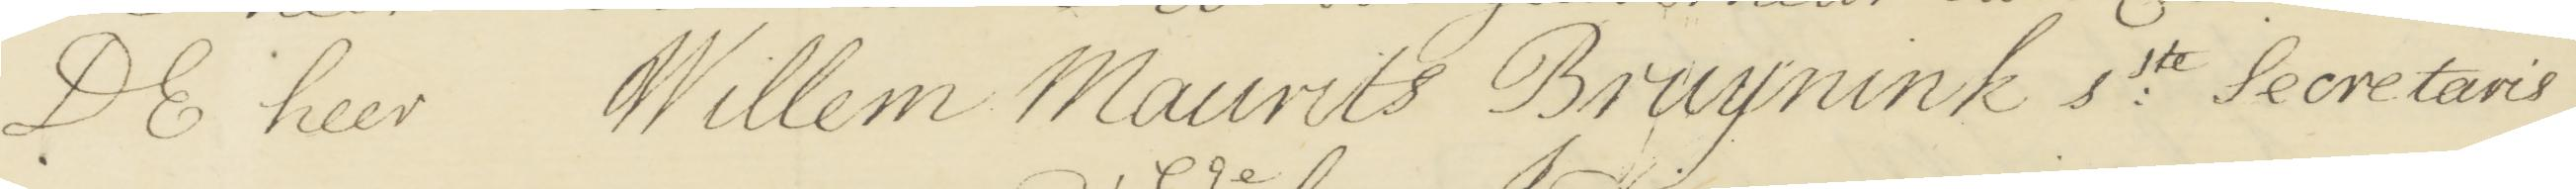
D E heer Willem Maurits Bruynink 1:ste Secretaris
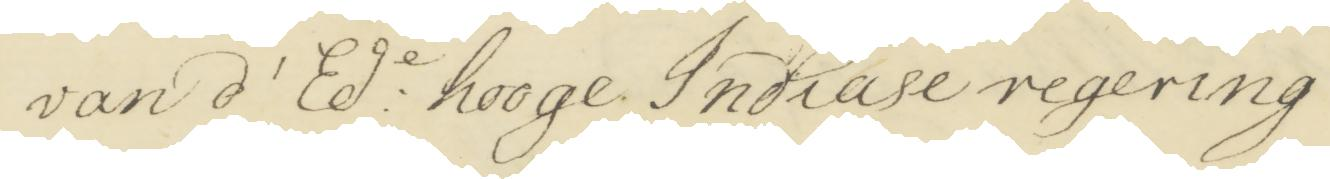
van d’ Ed:e hooge Indiase regering
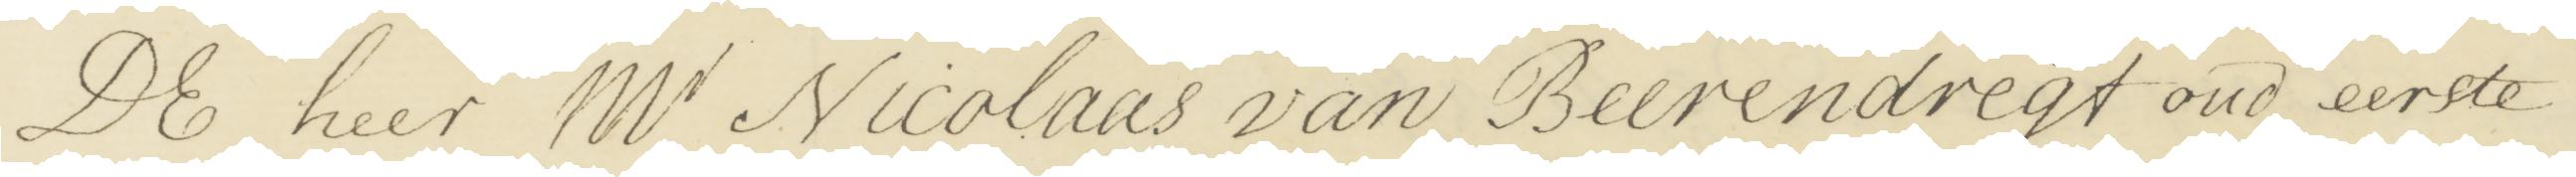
D E heer M:r Nicolaas van Beerendregt oud eerste
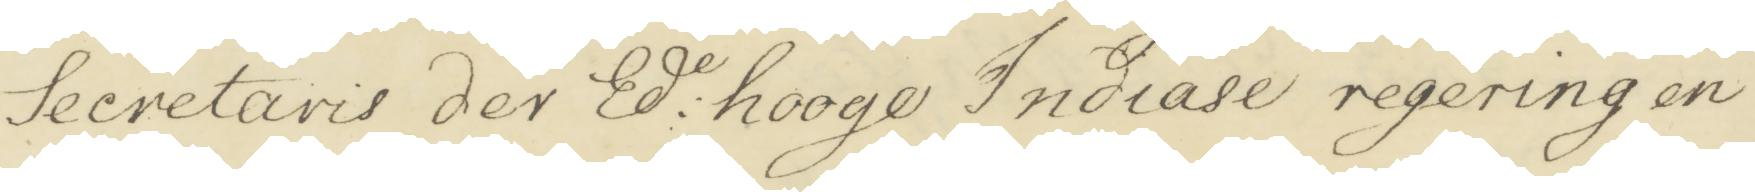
Secretaris der Ed:e hooge Indiase regering en
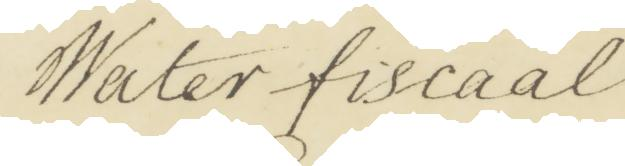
Waterfiscaal
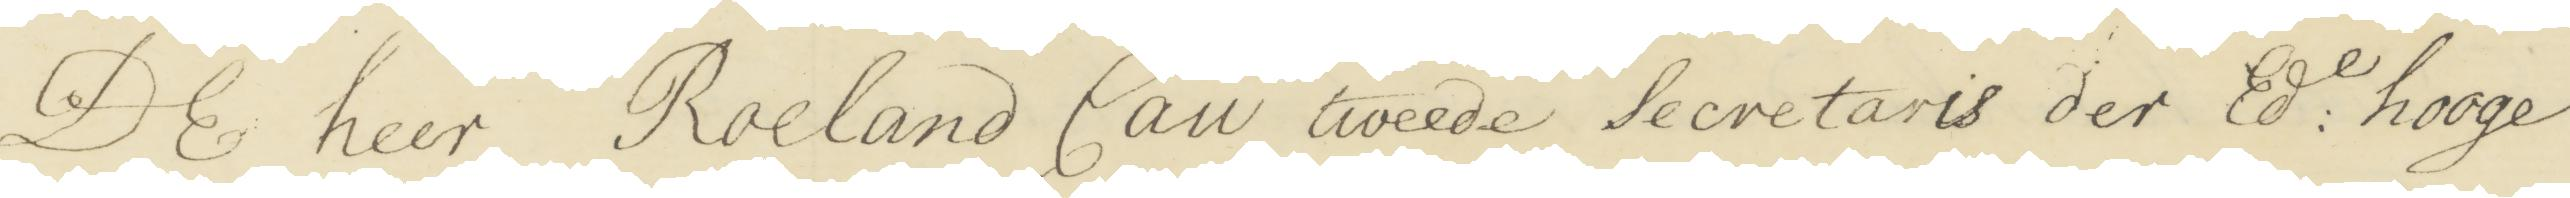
D E heer Roeland Cau tweede Secretaris der Ed:e hooge
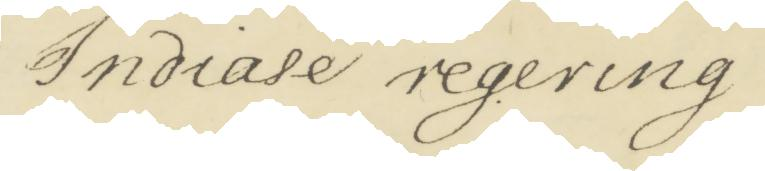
Indiase regering
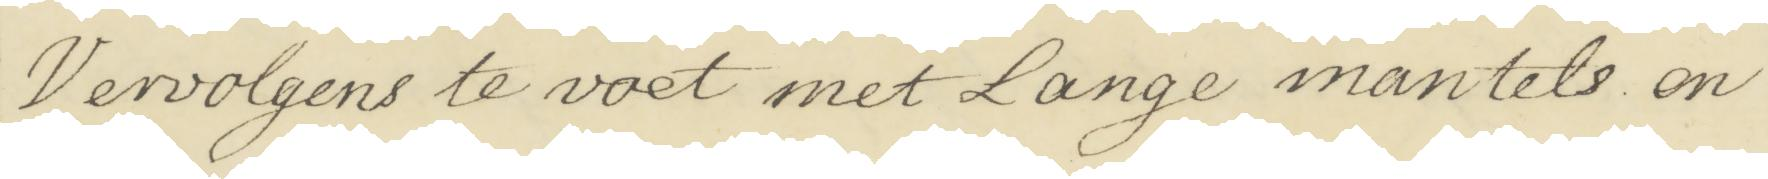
Vervolgens te voet met Lange mantels en
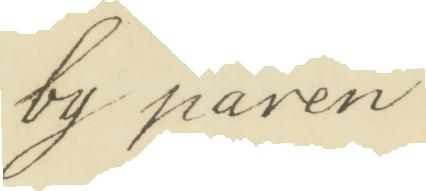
by paren
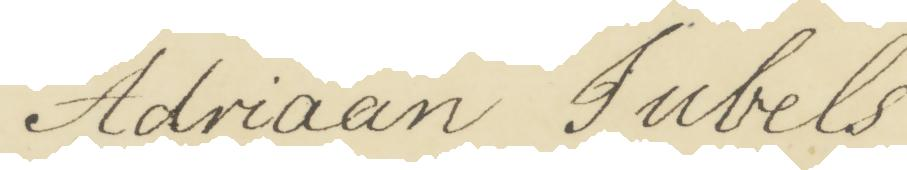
Adriaan Iubels
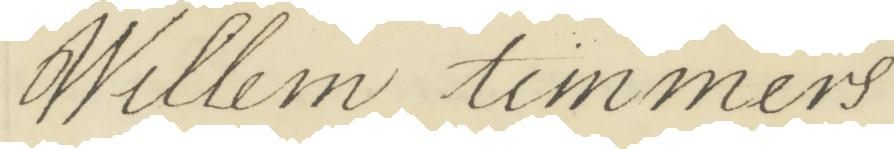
Willem timmers
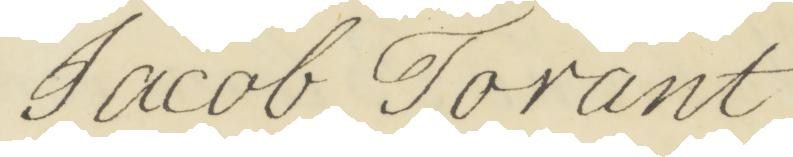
Jacob Torant
